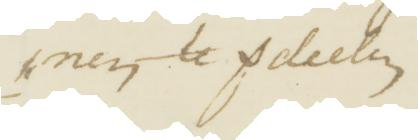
„nen te verdeelen
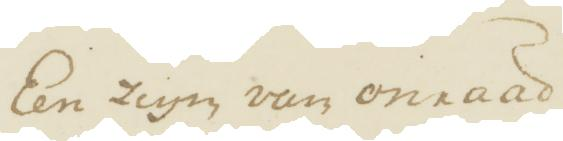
Een zeyn van onraad
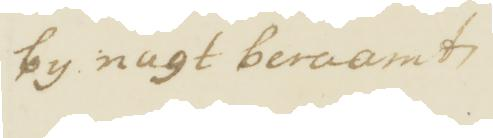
by nagt beraamt
